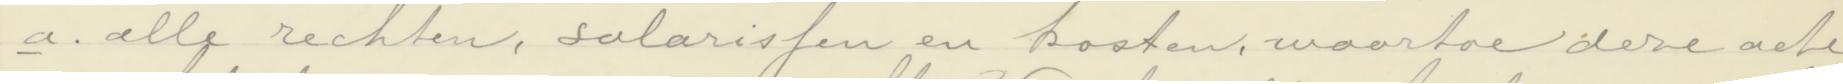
a. alle rechten, salarissen en kosten, waartoe deze acte
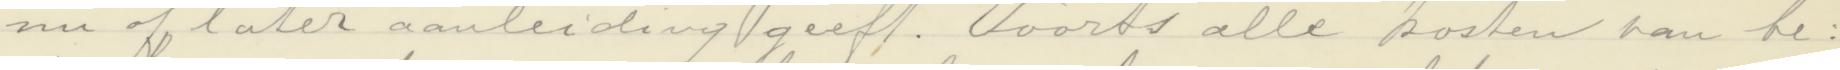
nu of later aanleiding geeft. Voorts alle posten van be
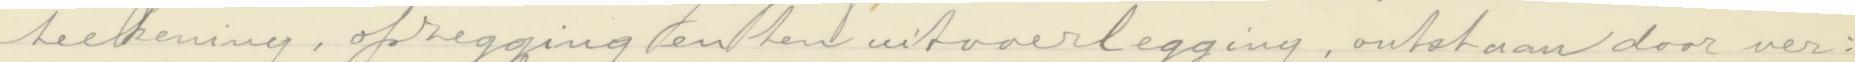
teekening, opzegging en ten uitvoerlegging, ontstaan door ver
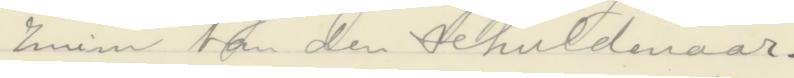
zuim van den schuldenaar
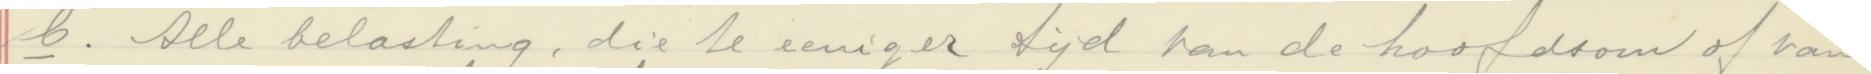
b. Alle belasting, die te eeniger tijd van de hoofdsom of van
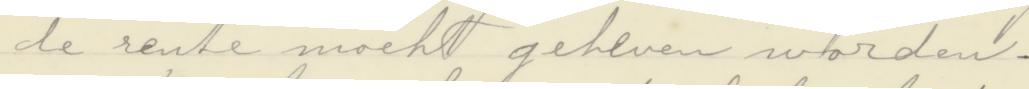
de rente mocht geheven worden
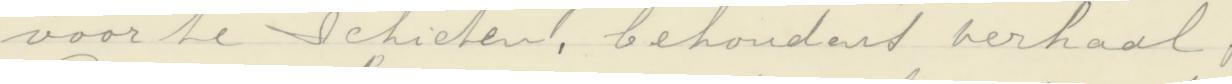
voor te schieten, behoudens verhaal
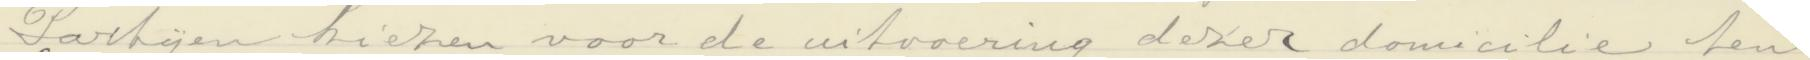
Partijen kiezen voor de uitvoering dezer domicilie ten
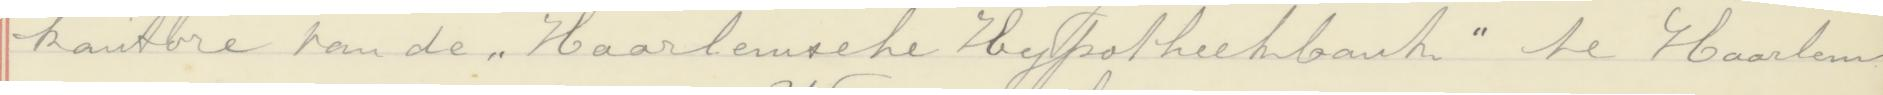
kantore van de „ Haarlemsche Hypotheekbank " te Haarlem
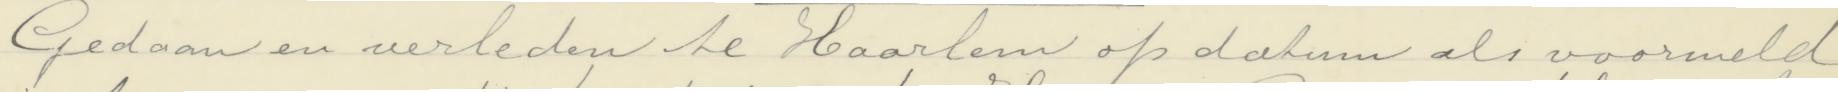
Gedaan en verleden te Haarlem op datum als voormeld
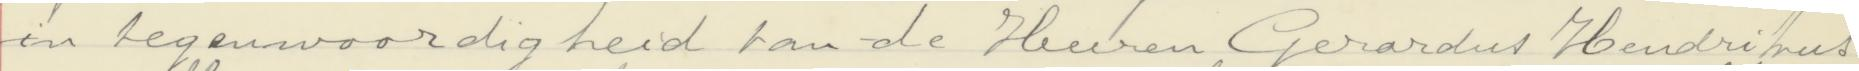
in tegenwoordigheid van de Heeren Gerardus Hendrikus
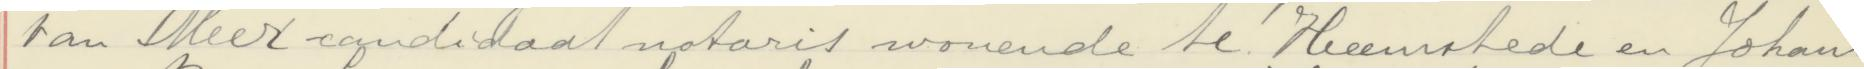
van Meer candidaat notaris wonende te Heemstede en Johan
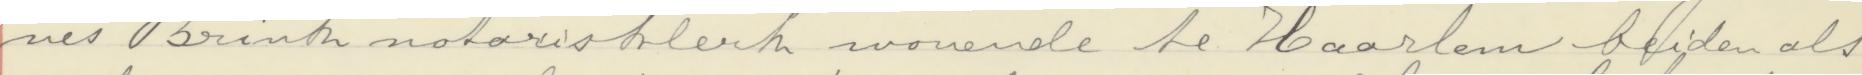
nes Brink notarisklerk wonende te Haarlem beiden als
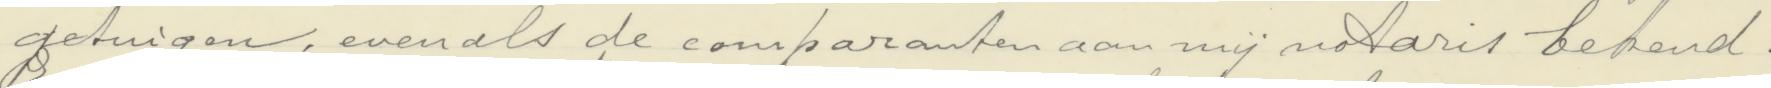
getuigen, even als de comparanten aan mij notaris bekend
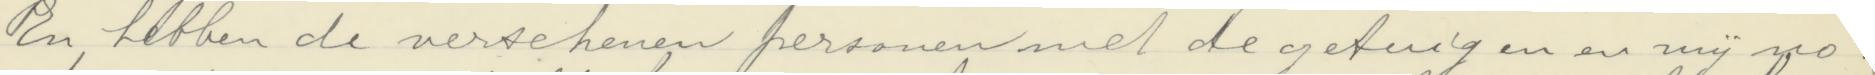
En hebben de verschenen personen met de getuigen en mij no
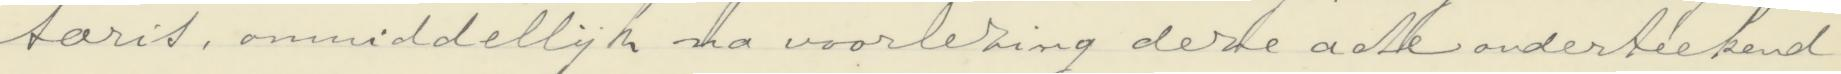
taris, onmiddellijk na voorlezing deze acte onderteekend
